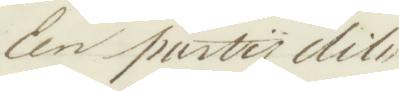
Een partij dito
